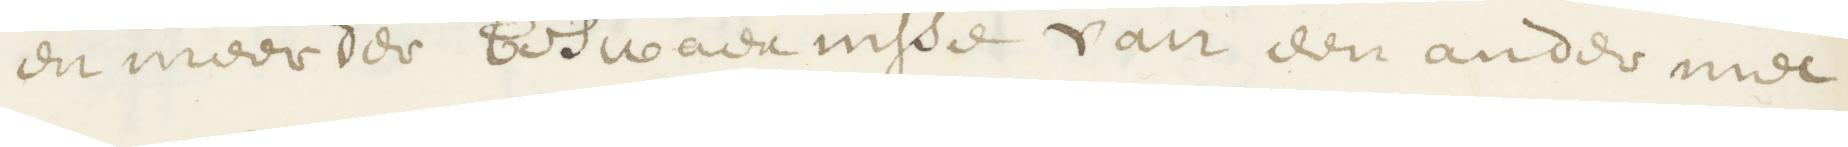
en meerder beswaernisse van een ander niet
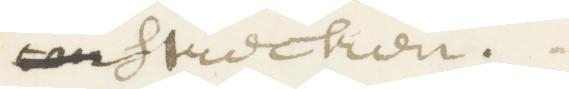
can strecken.
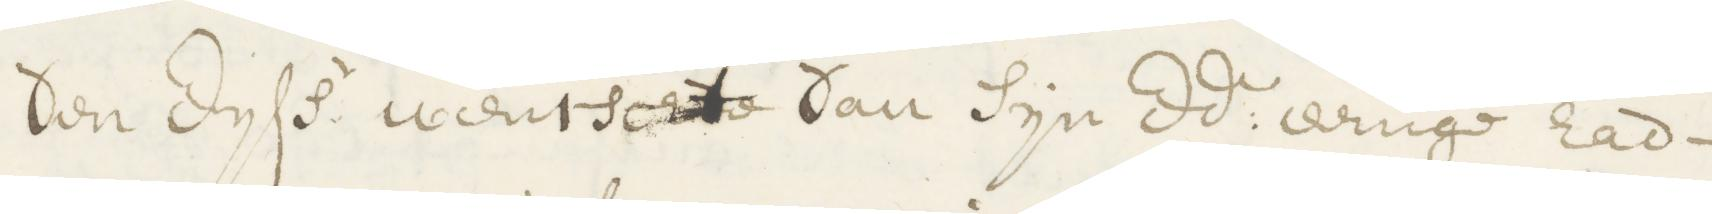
den Eijss:r wentschte dan sijn Ed: eenige had
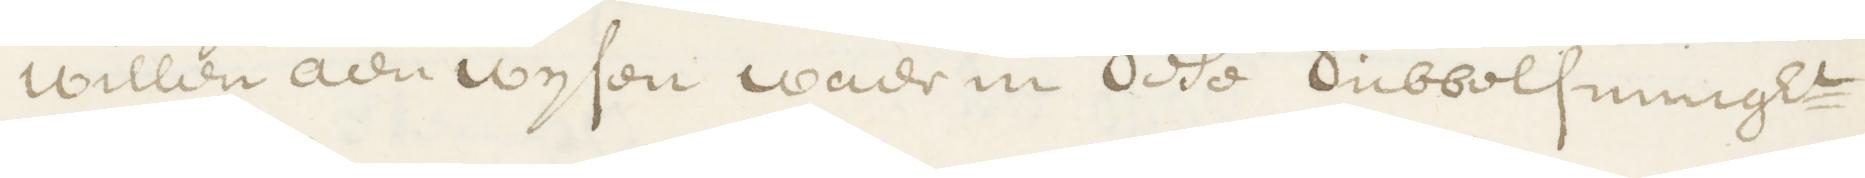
willen aen wijsen waer in dese dubbelsinnigh=t
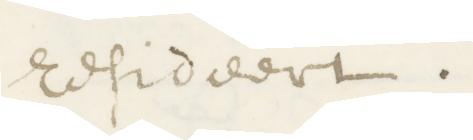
resideert.
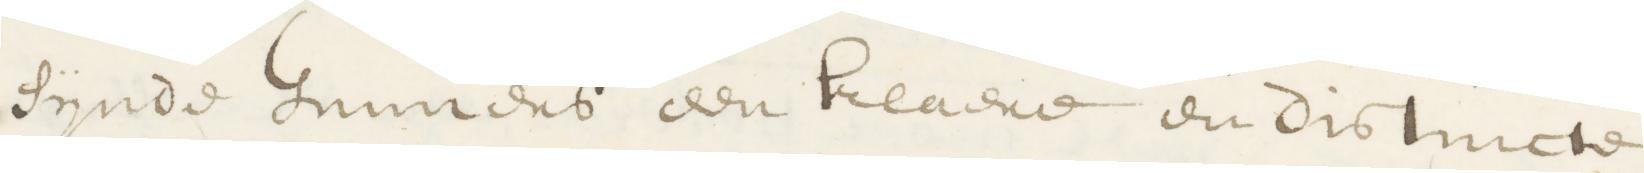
sijnde Immers een klaere en distincte
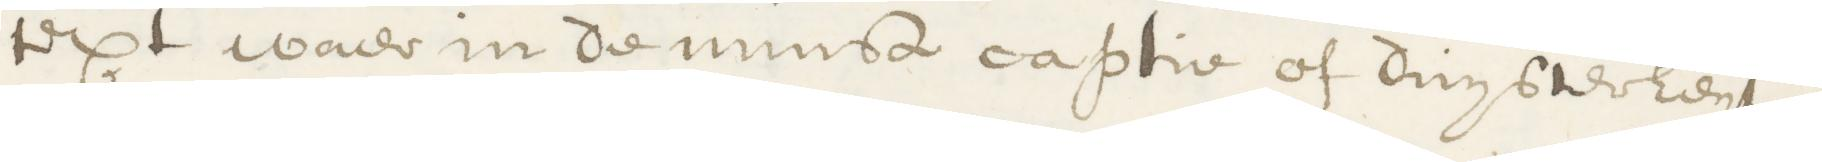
text waer in de minst captie of duijsterheijt
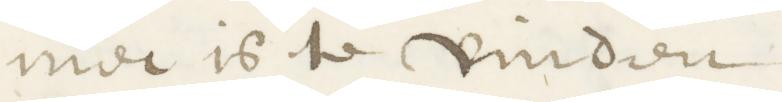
niet is te vinden
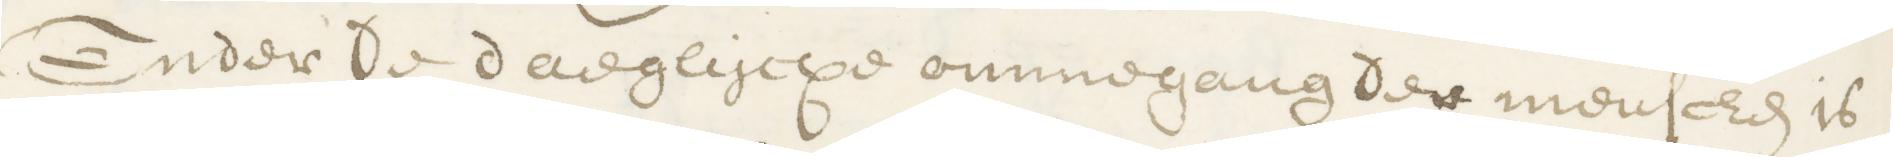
Onder de daeglijcxe ommegang der menschen is
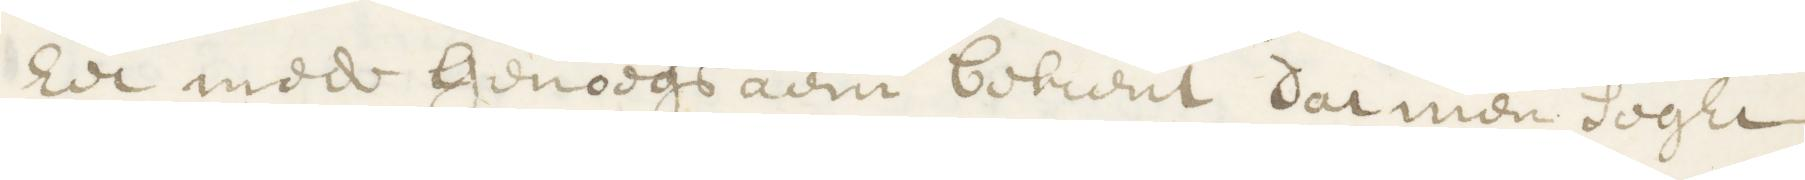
het mede genoegsaem bekent dat men seght
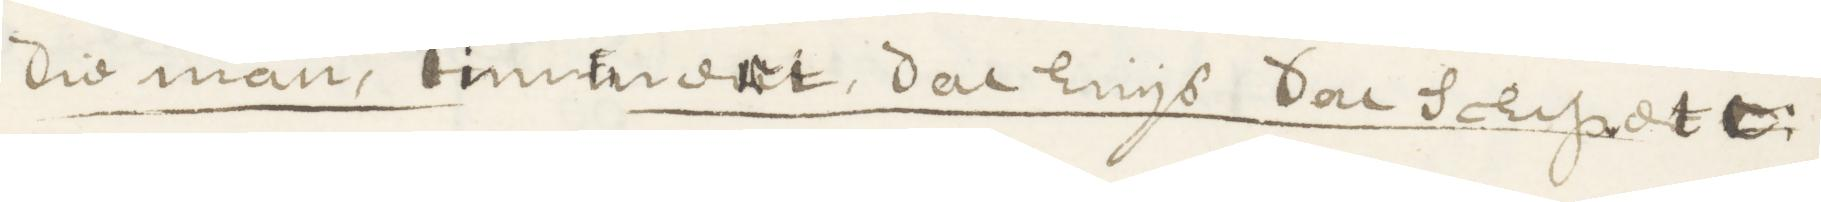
die man, timmert, dat huijs dat schip etc:
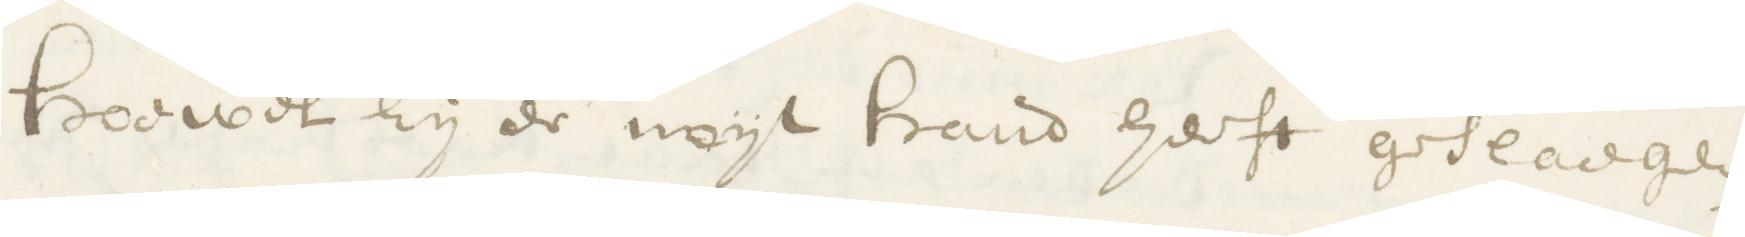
Hoewel hij er noijt hand heeft geslaegen
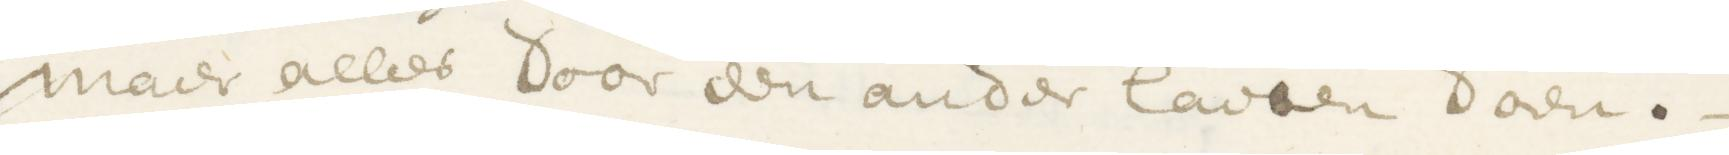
maer alles door een ander laeten doen.
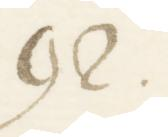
92.
